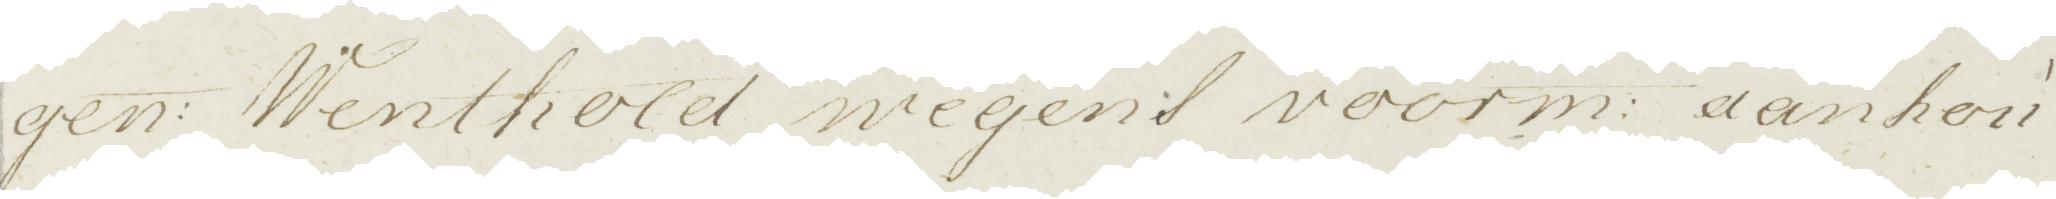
gen: Wenthold wegens voorm: aanhou
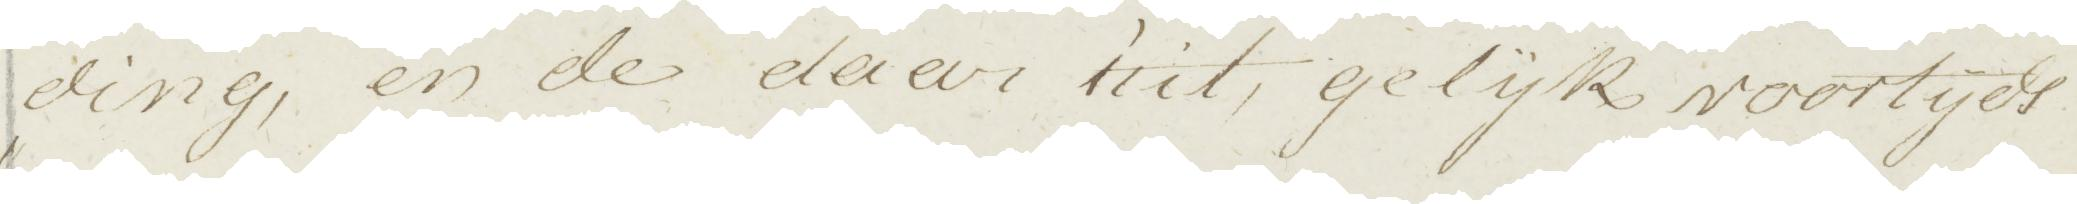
„ding, en de daar uit, gelijk voortijds
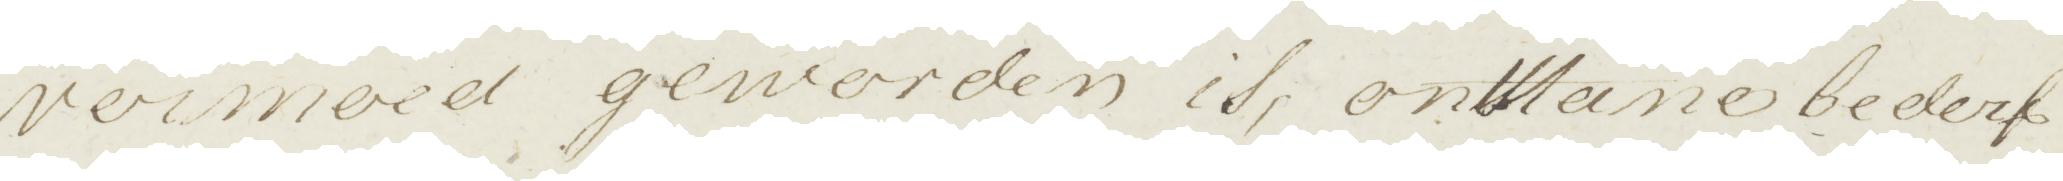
vermoed geworden is; ontstane bederf
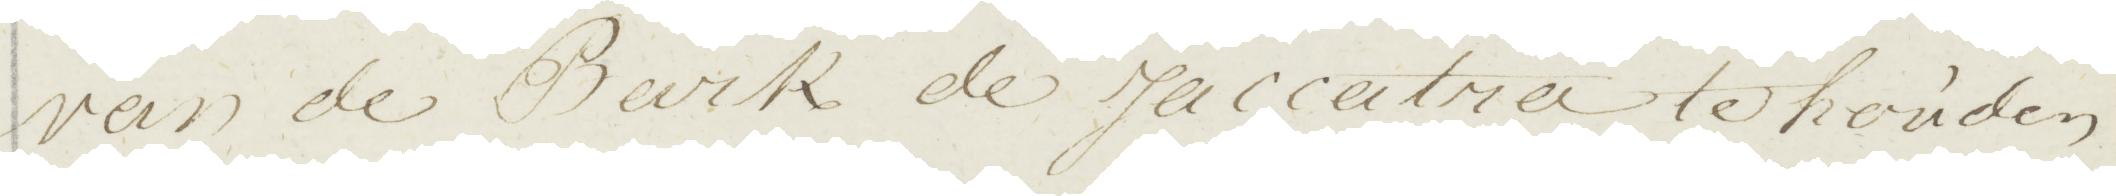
van de Bark de Jaccatra te houden
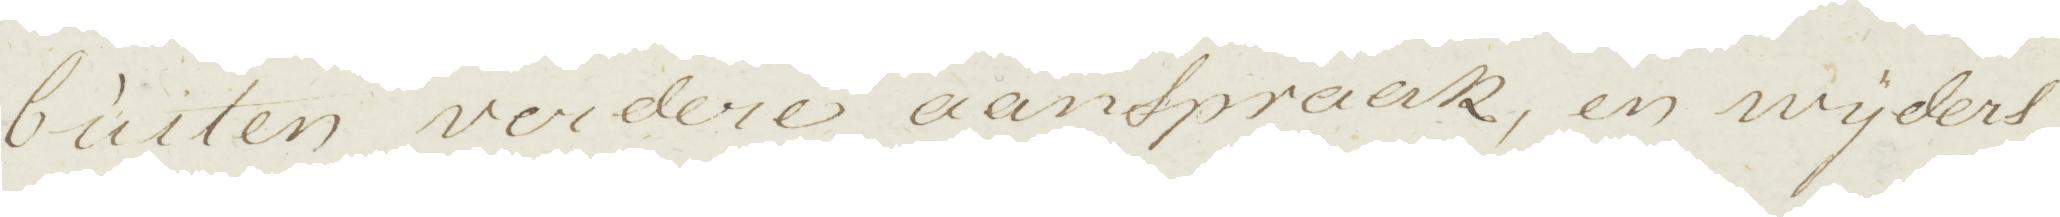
buiten verdere aanspraak, en wijders
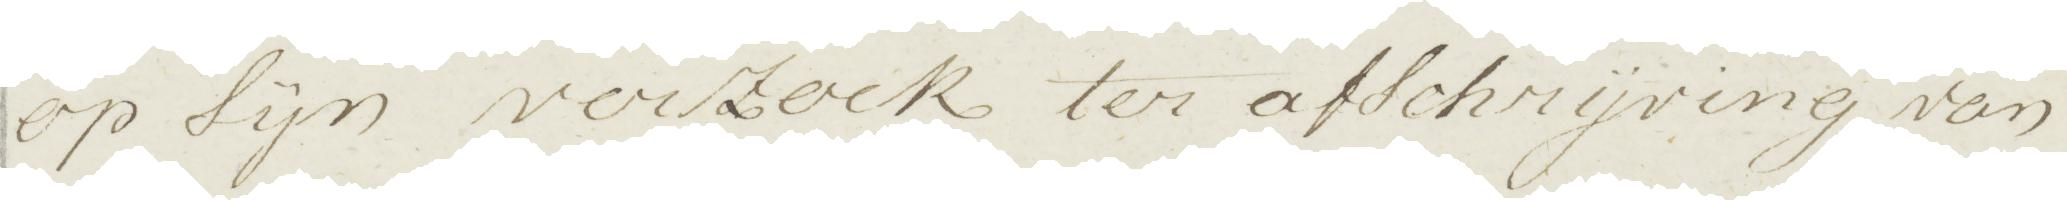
op sijn verzoek ter afschrijving van
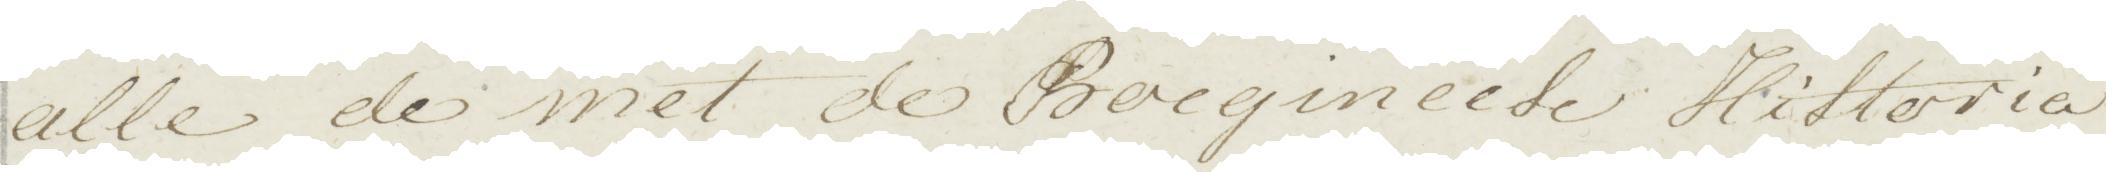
alle de met de Boegineese Historia
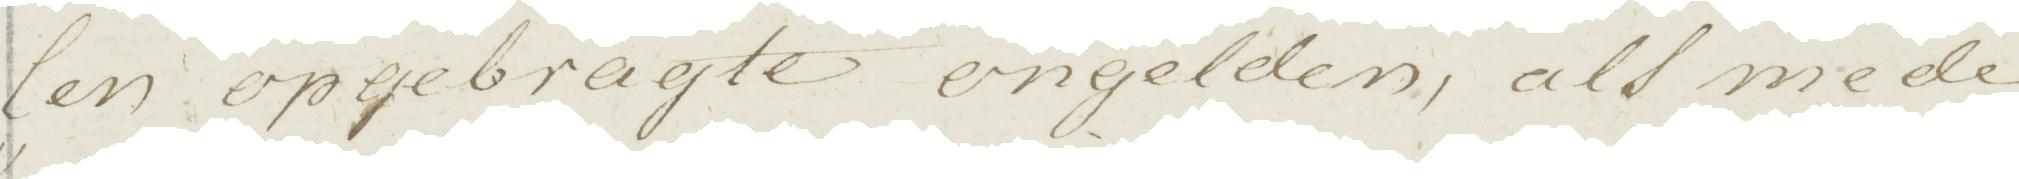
„len opgebragte ongelden, als mede
